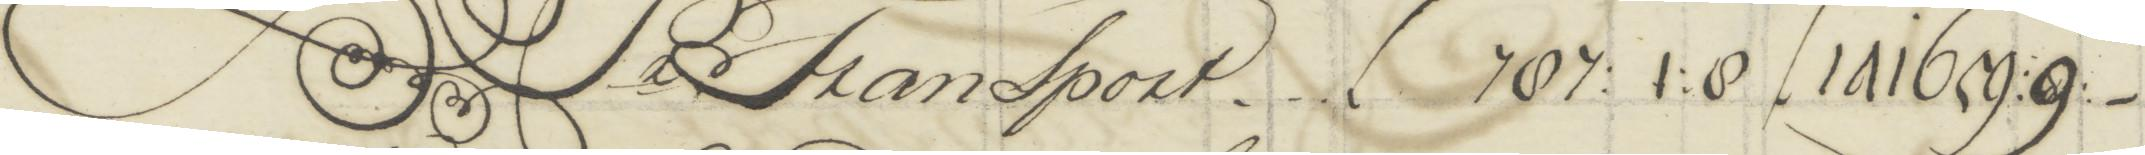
P=r Transport ƒ 787: 1:8 ƒ 141659:9:—
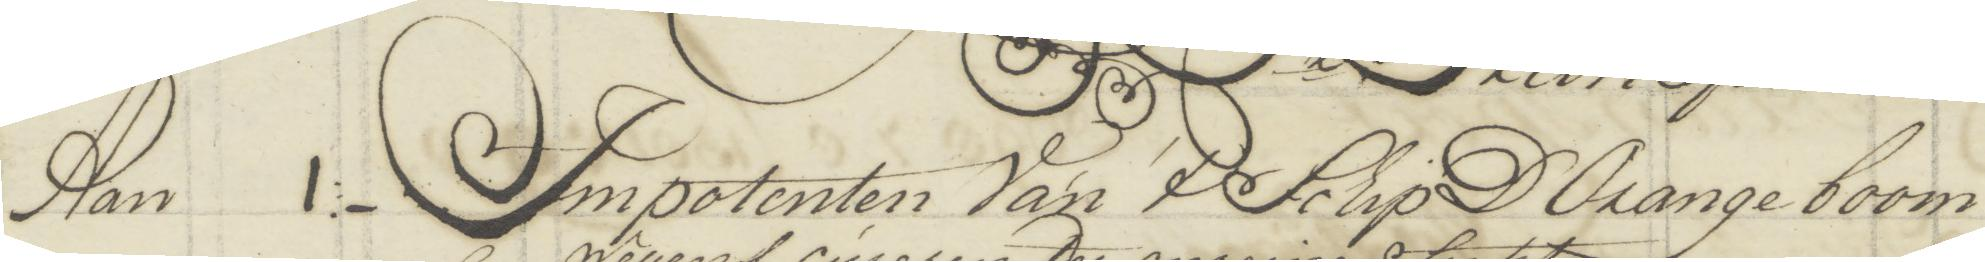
Aan 1:— Impotenten van ’t Schip D Orange boom
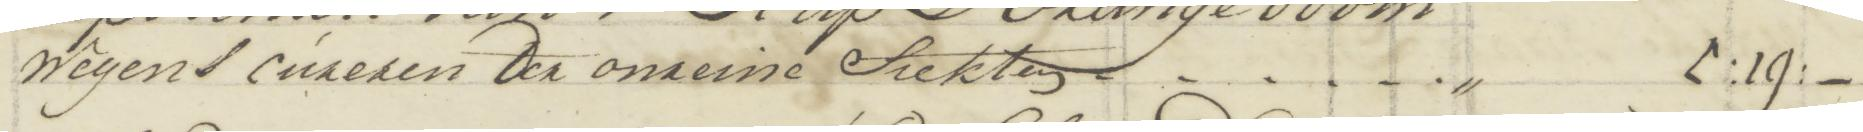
wegens cureren der onreine siekten - - - - - „ 5:19:—
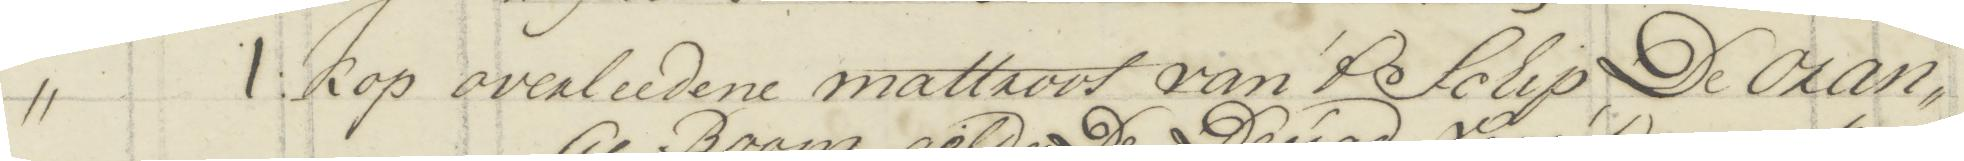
„ 1: kop overleedene mattroos van ’t Schip De Oran„
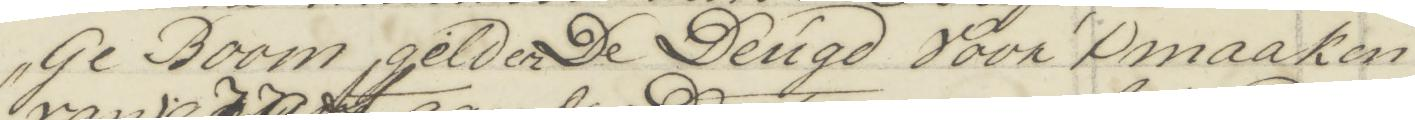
„ge Boom gelder De Deugd voor 't maaken
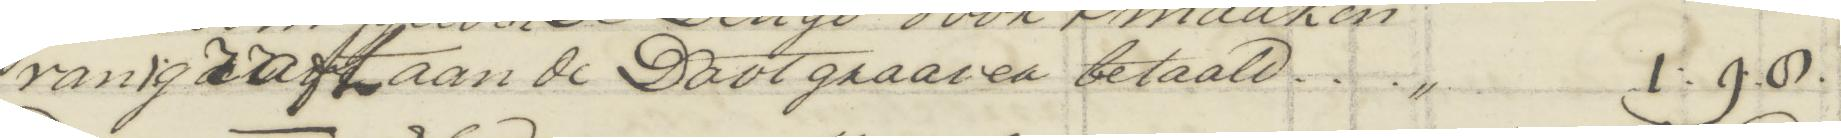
van graft aan de Doot graaver betaald - - - „ 1: 9:8.
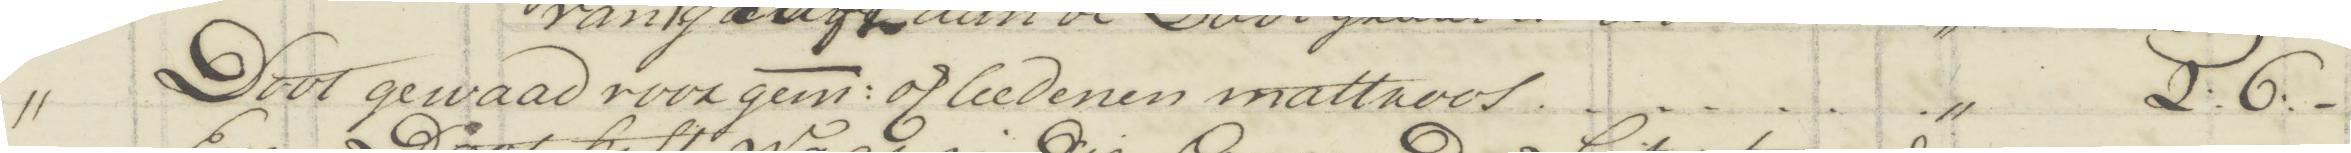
„ Doot gewaad voor gem: overledenen mattroos - - - - - - - „ 2:6:—
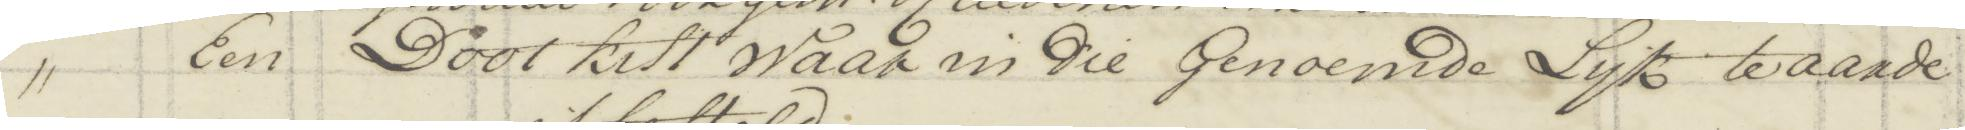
„ Een Doot kist waar in die genoemde Lijk te aarde
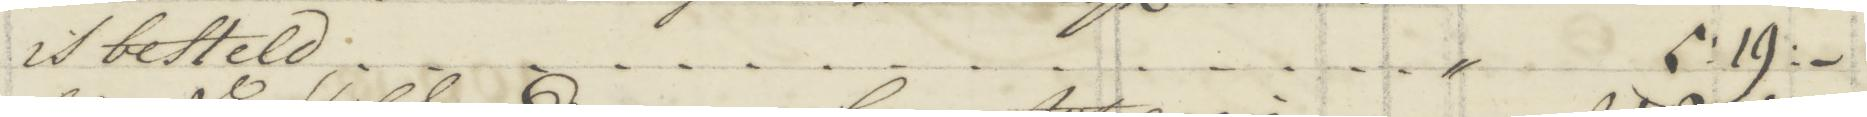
is besteld - - - - - - - - - - - - - - - „ 5:19:—
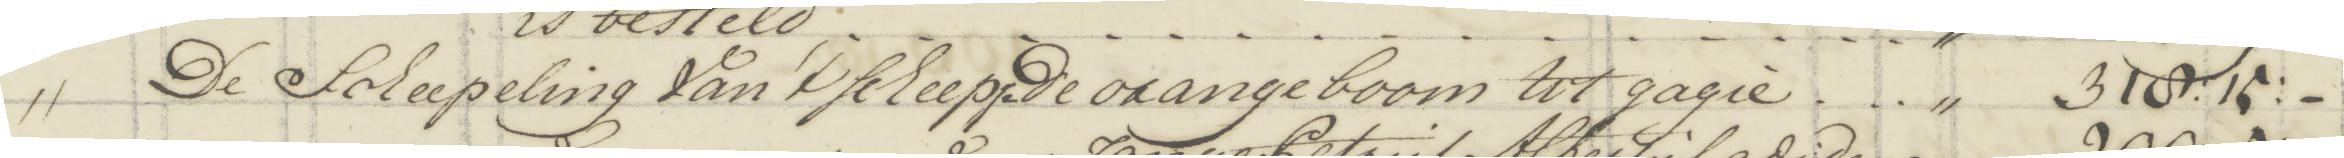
„ De Scheepeling van ’t scheepje de orangeboom tot gagie - - - „ 318:15:—
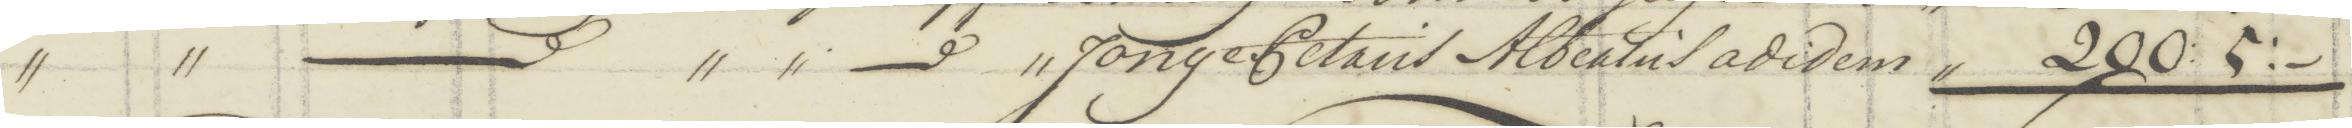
„ „ _o „ „ _o „ Jonge Petrus Albertus adidem „ 200: 5:—
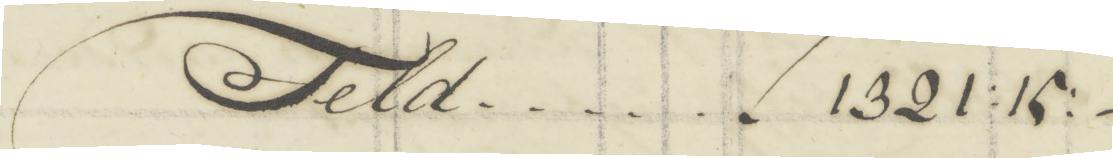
Teld - - - - - ƒ 1321:15:—
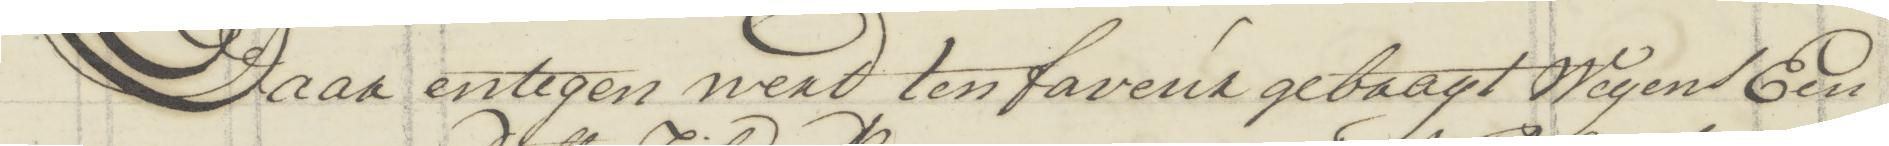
Daar en tegen werd ten faveur gebragt Wegens Een
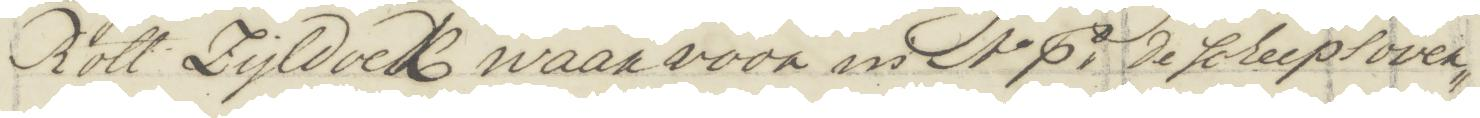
Roll: Zijldoek waar voor in Ao p„o de scheeps over„
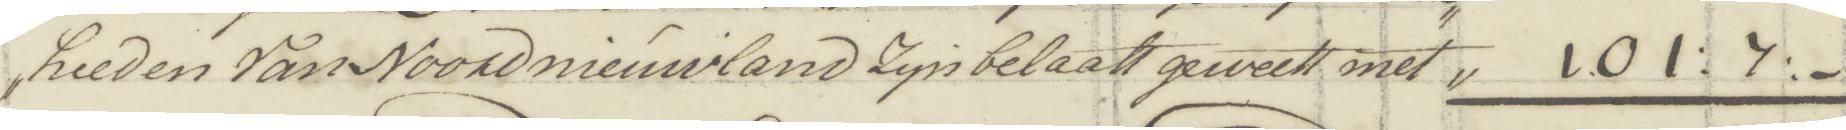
„heeden van Noordnieuwland zijn belaast geweest met „ 101: 7:—
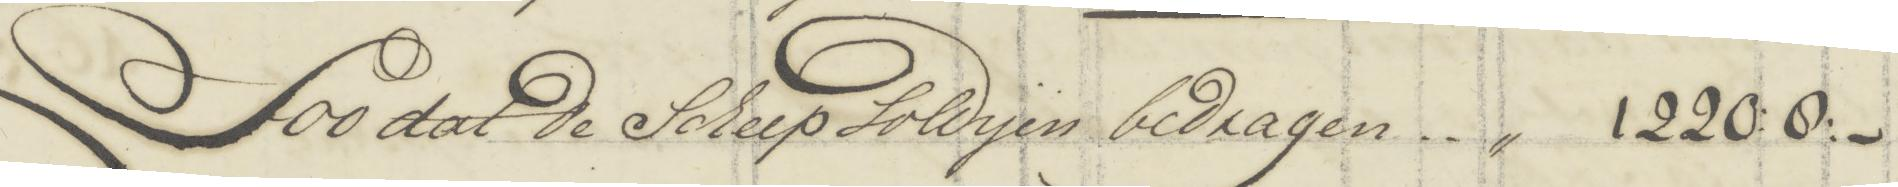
Soo dat de scheep soldijen bedragen - - „ 1220: 8:—
